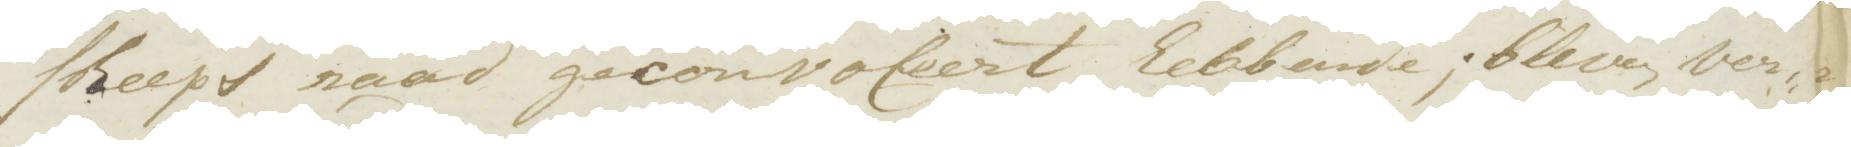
scheeps raad geconvoceert hebbende ; bleven ver„
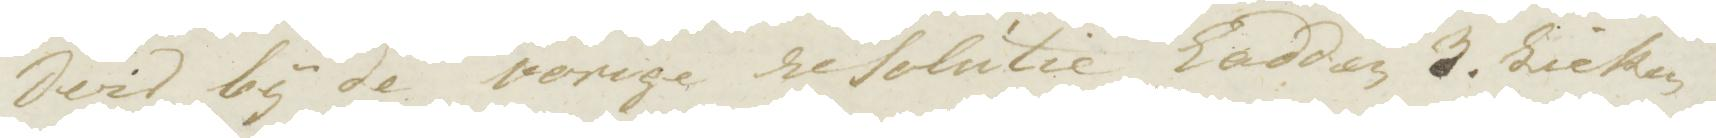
ders bij de vorige resolutie hadden 3. zieken
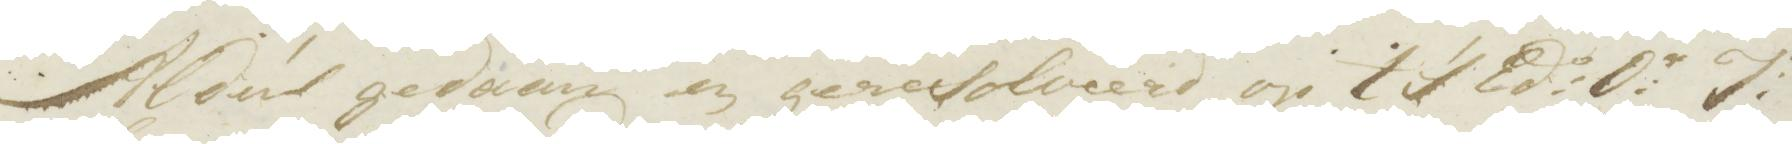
Aldus gedaan en geresolveerd op ’t 's Ed:e O:t I:
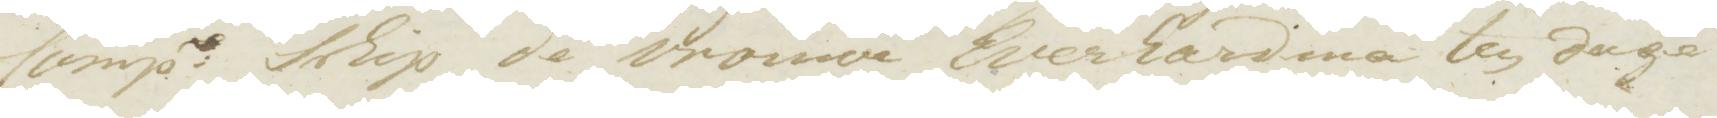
Comp:s schip de vrouwe Everhardina ten dage
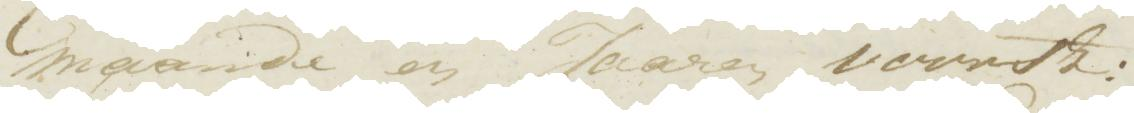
maande en Jaaren voorsz:
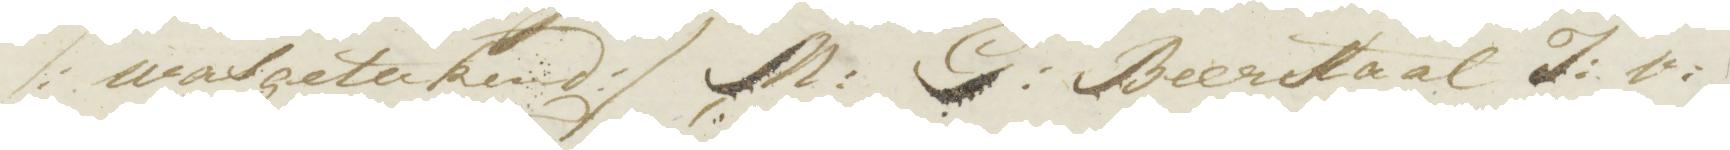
/: was geteekend:/ M: G: Beerstaal I: v:
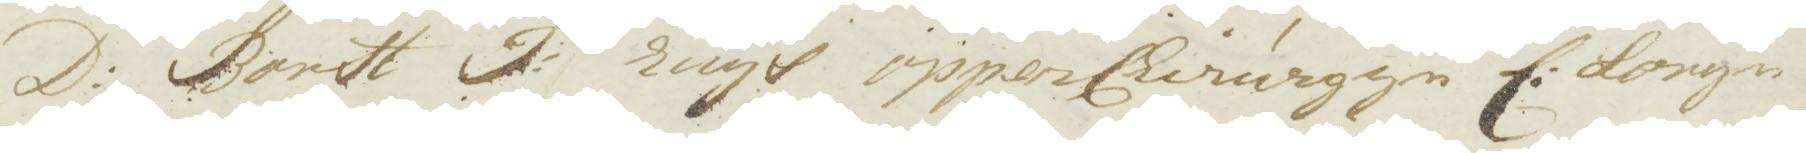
D: Borst T: Ruys opperchirurgyn C: Loryn
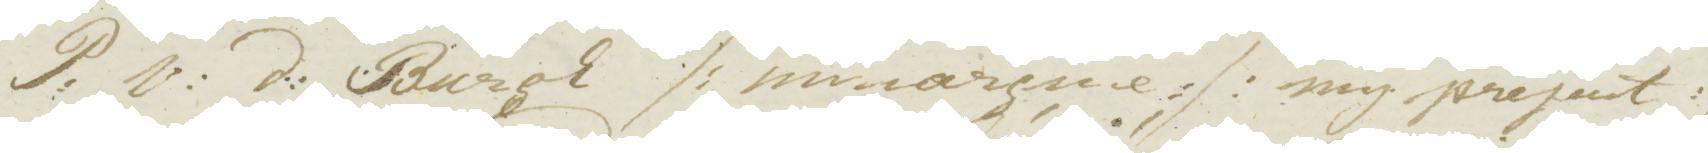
P: v: d: Burgh /: in margine:/: my present:
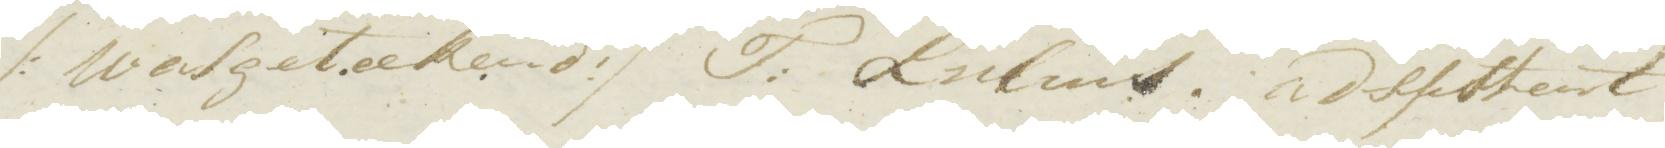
/: was geteekend:/ T: Lucius. adssistent
